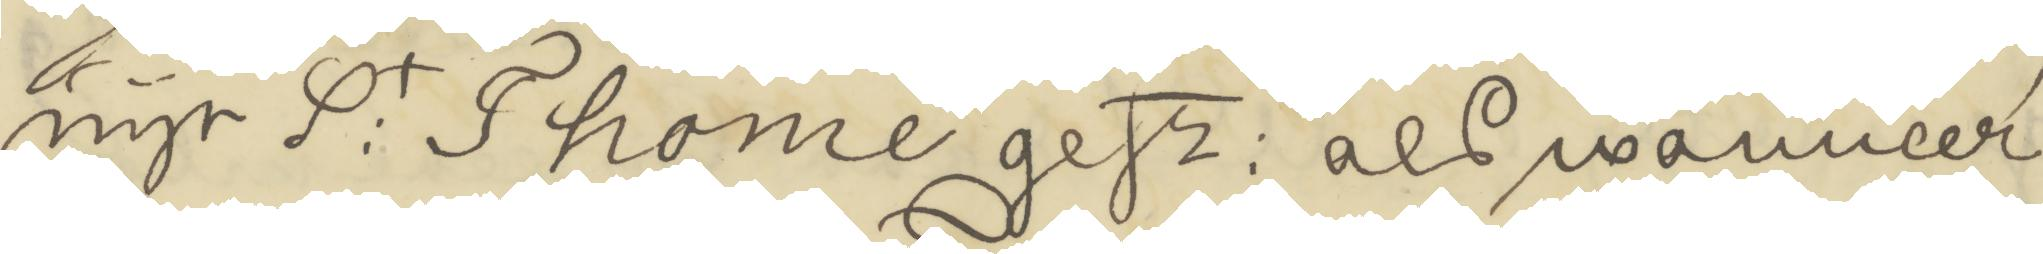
uijt S:t Thomé gesz: als wanneer
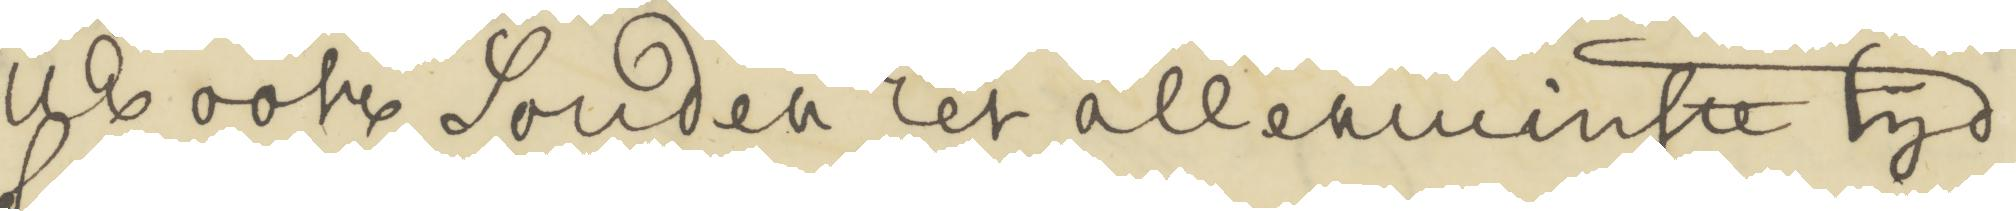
UE ook sonder het allerminste tijd
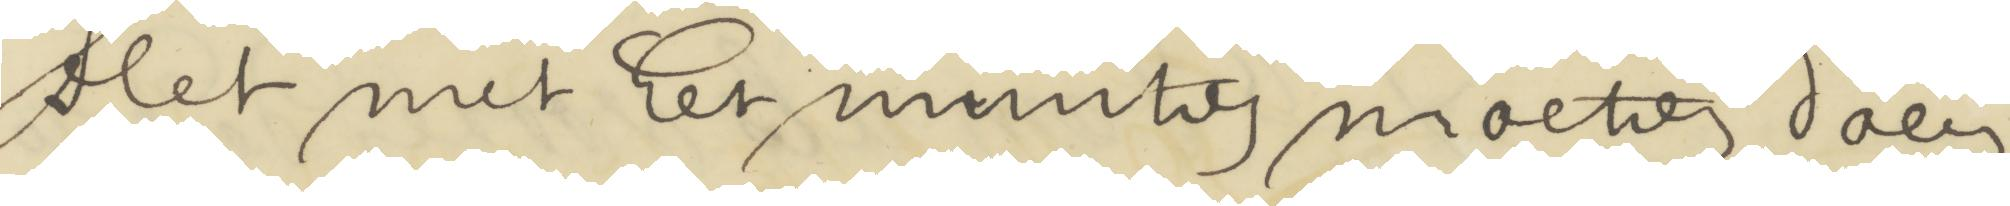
verlet met het munten moeten doen
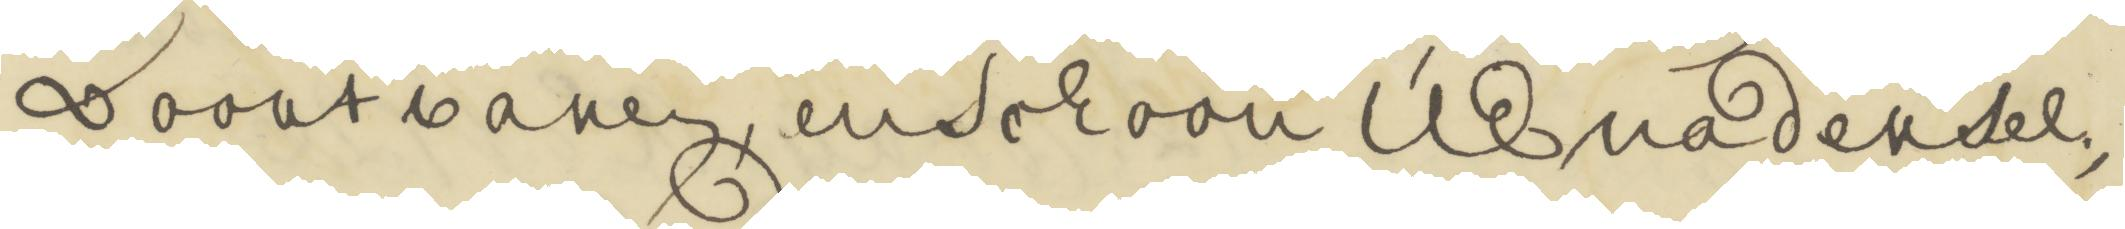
voort varen, en schoon UE na dersel„
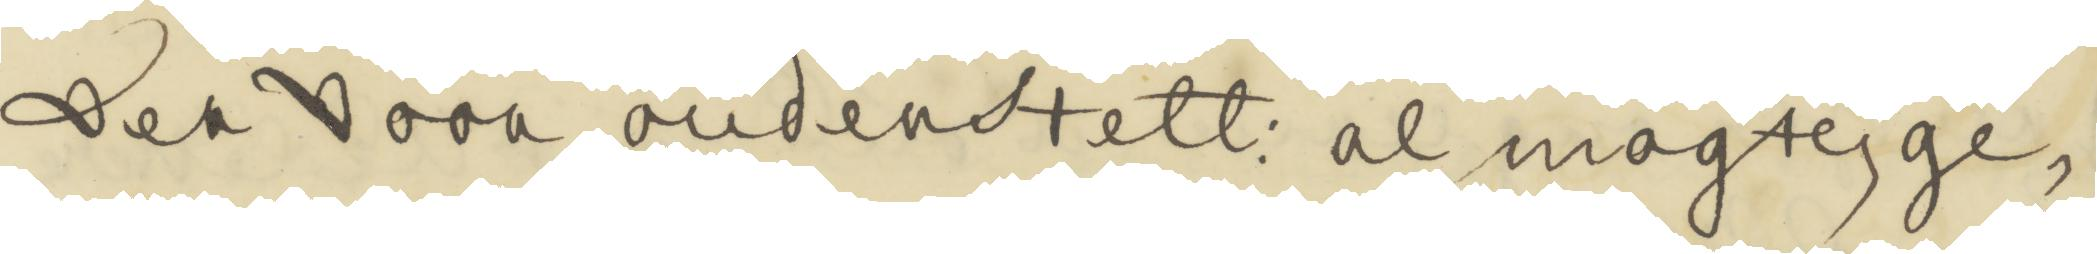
ver voor onderstell: al mogten ge„
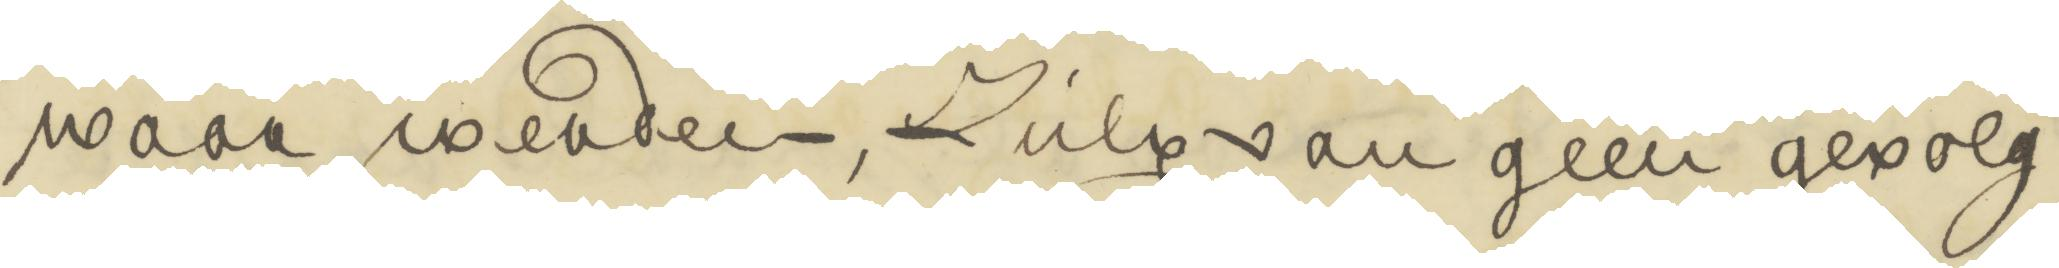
waar werden, zulx van geen gevolg
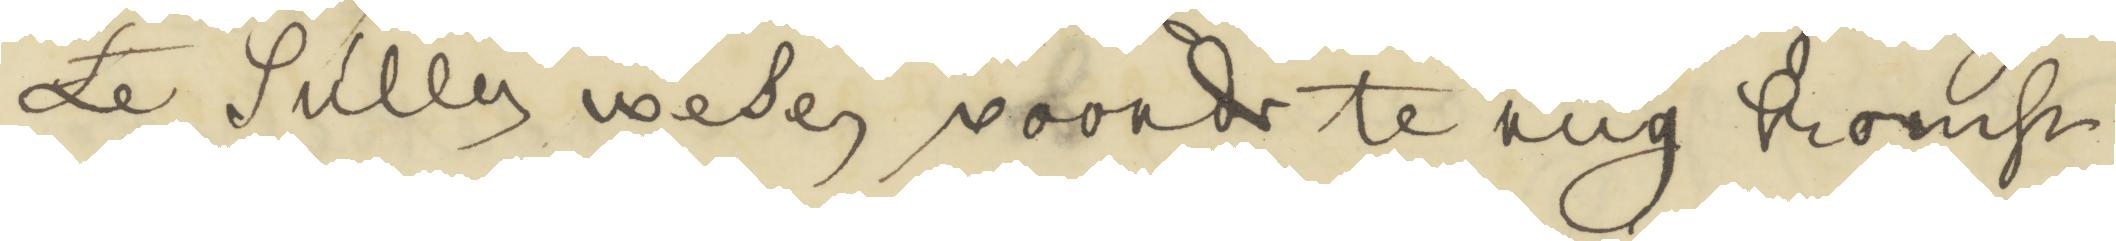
te sullen wesen voor de te rug komst
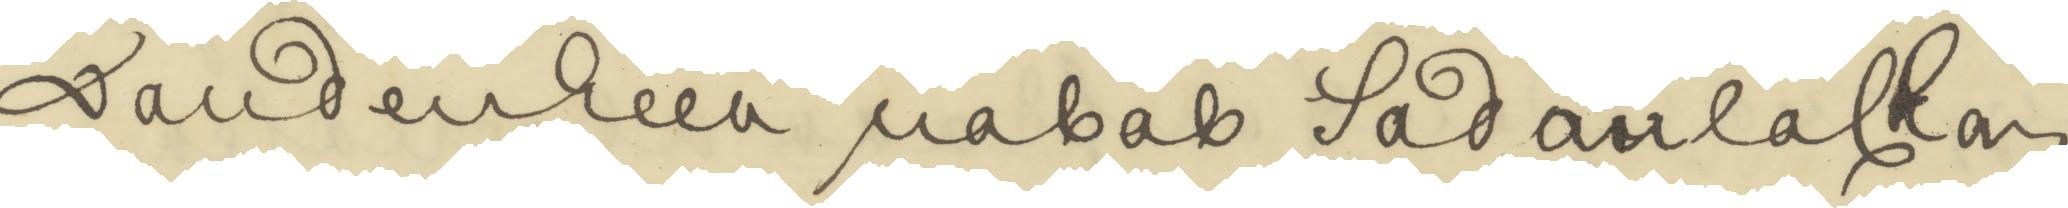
van den heer nabab sad aulackan
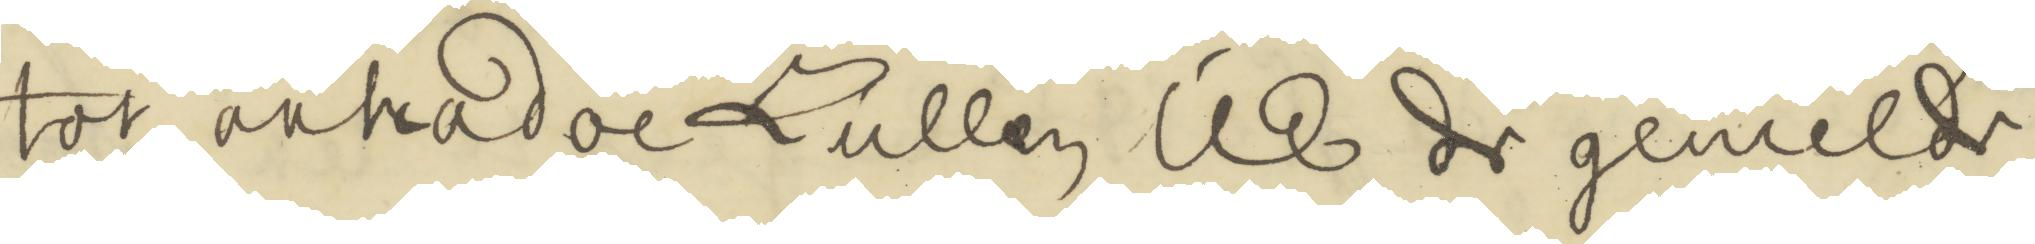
tot orkadoe zullen UE de gemelde
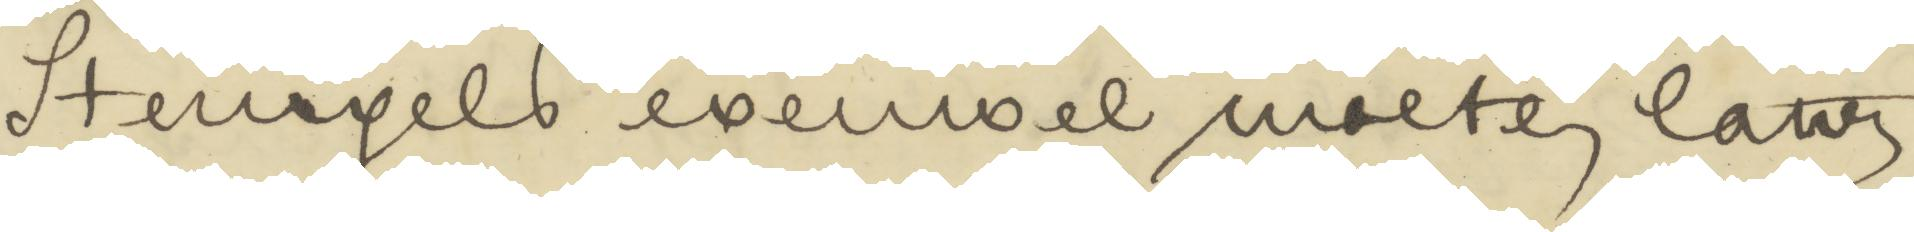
stempels evenwel moeten laten
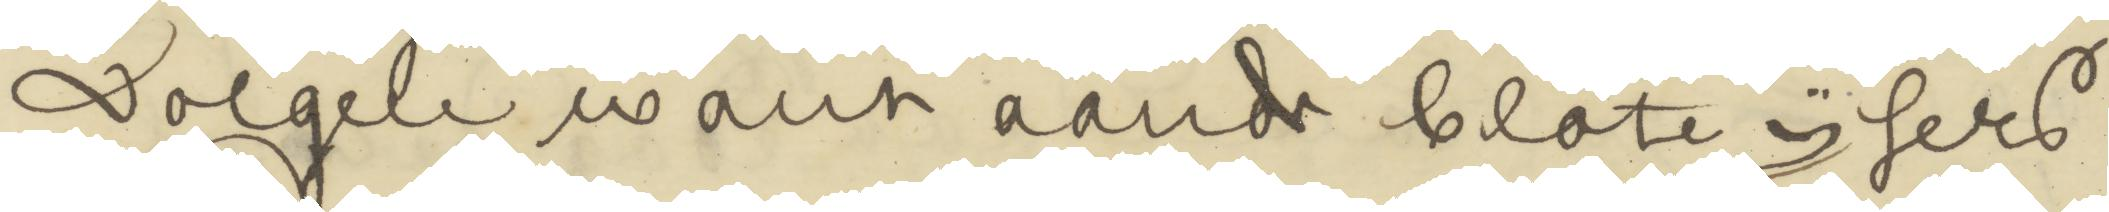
volgen want aande blote ijsers
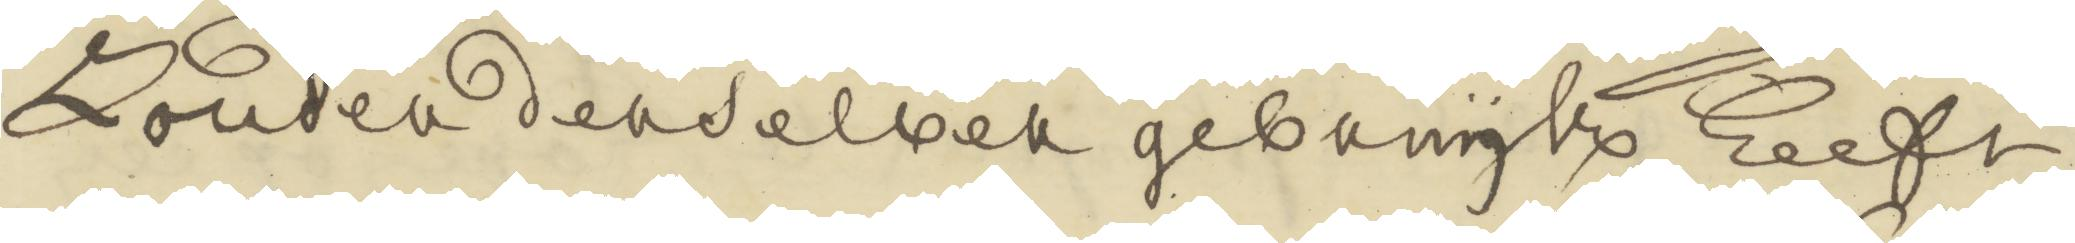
zonder derselver gebruijk heeft
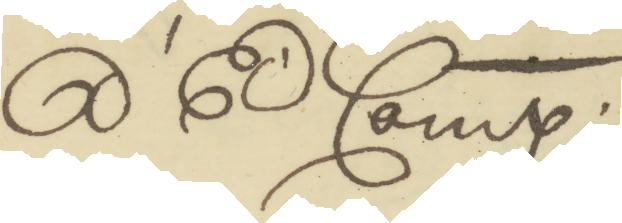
d’E Comp;
